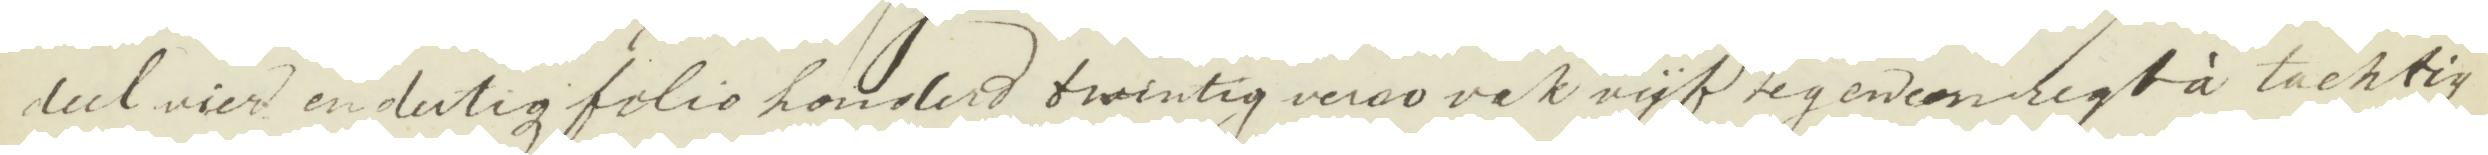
deel vier en dertig folio honderd twintig verso vak vijf tegen een regt à tachtig
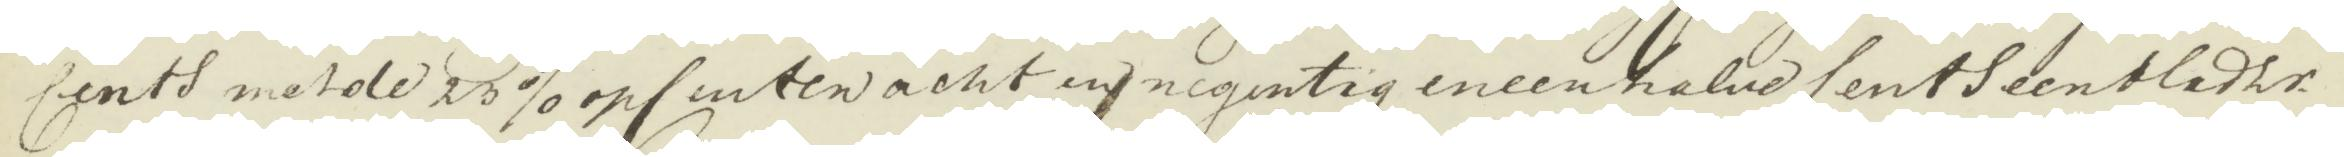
Cents met de 23% opCenten acht en negentig en een halve Cents een bladhr.
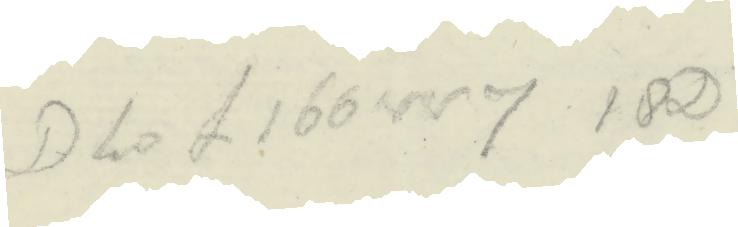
Dito ƒ 166 VV7 18D
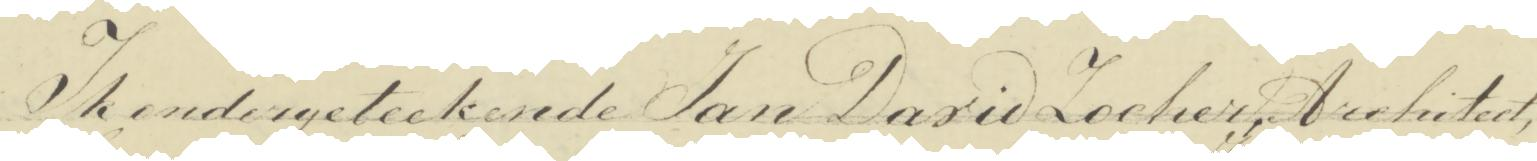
Ik ondergeteekende Ian David Zocher, Architect,
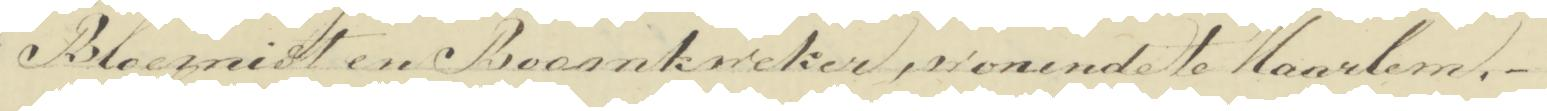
Bloemist en Boomkweker, wonende te Haarlem, —
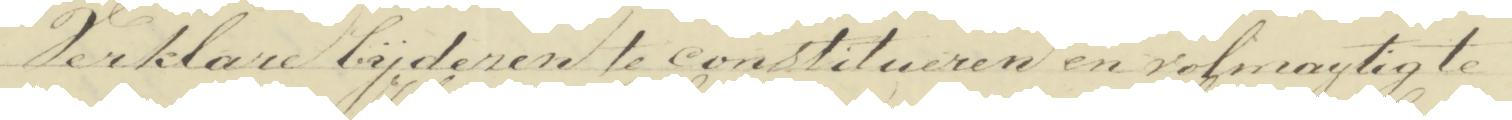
Verklare bij dezen te constitueren en volmagtig te
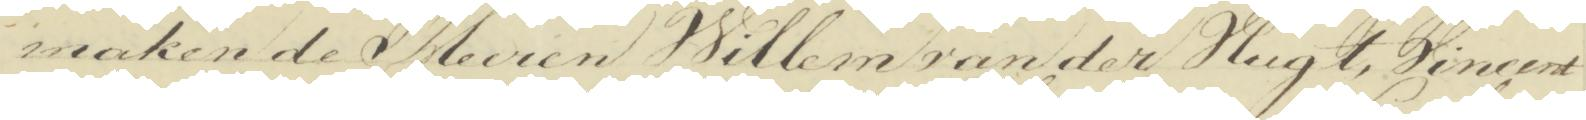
maken de Heeren Willem van der Vlugt, Vincent
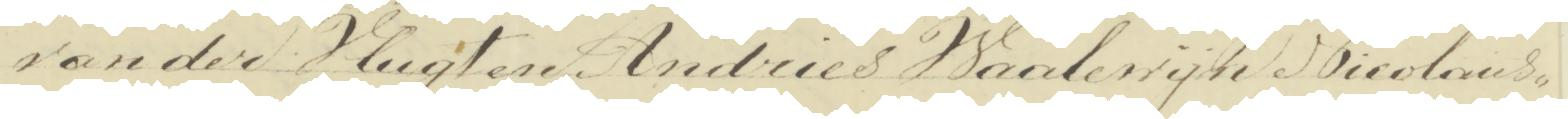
van der Vlugt en Andries Waalewijn Nicolaas„
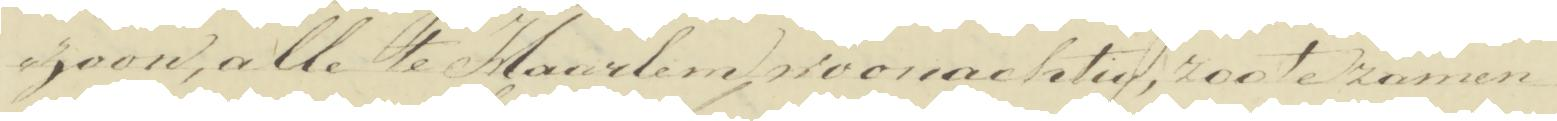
„zoon, alle te Haarlem woonachtig, zoo te zamen
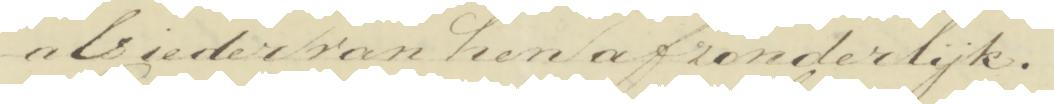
als ieder van hen afzonderlijk.
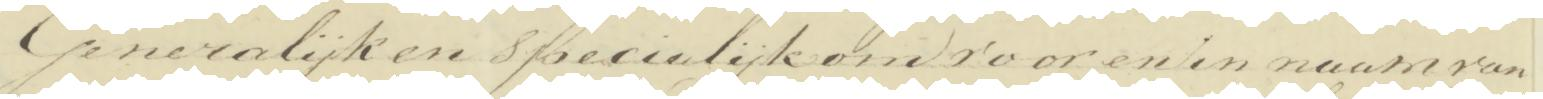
Generalijk en specialijk om voor en in naam van
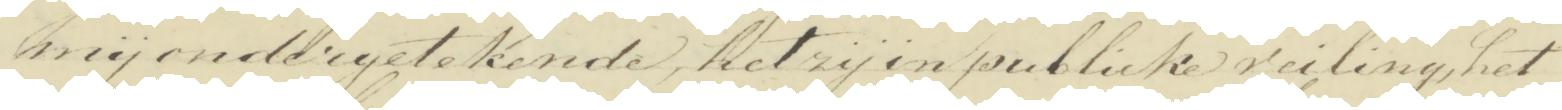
mij ondergetekende, het zij in publieke veiling, het
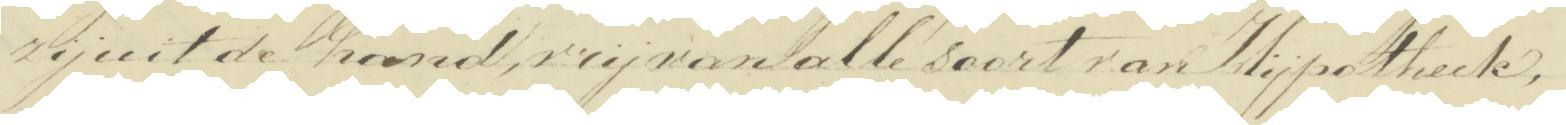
zij uit de hand, vrij van alle soort van Hijpotheek,
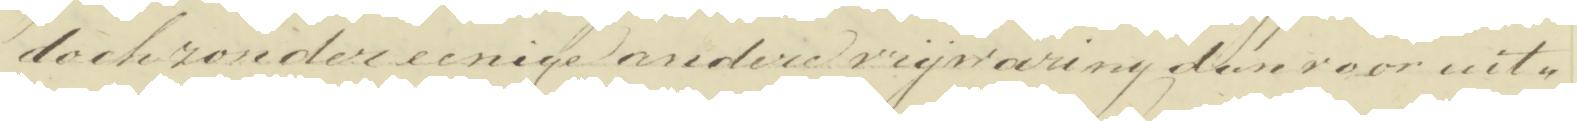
doch zonder eenige andere vrijwaring dan voor uit„
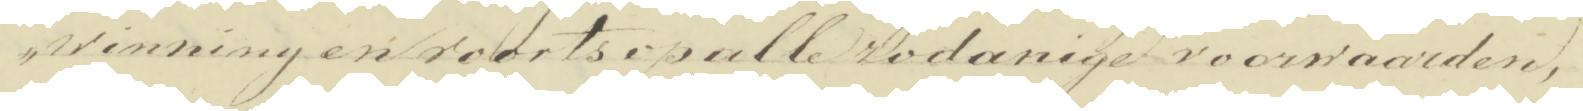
„winning en voorts op alle zodanige voorwaarden,
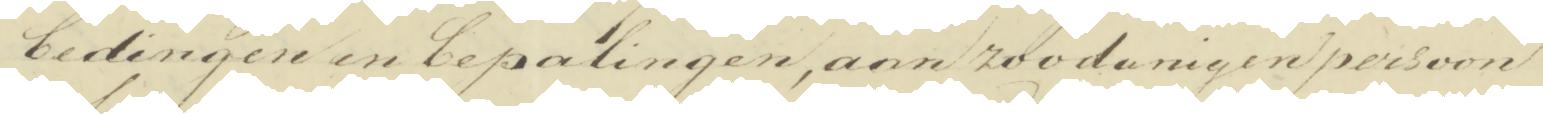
bedingen en bepalingen, aan zoodanigen persoon
